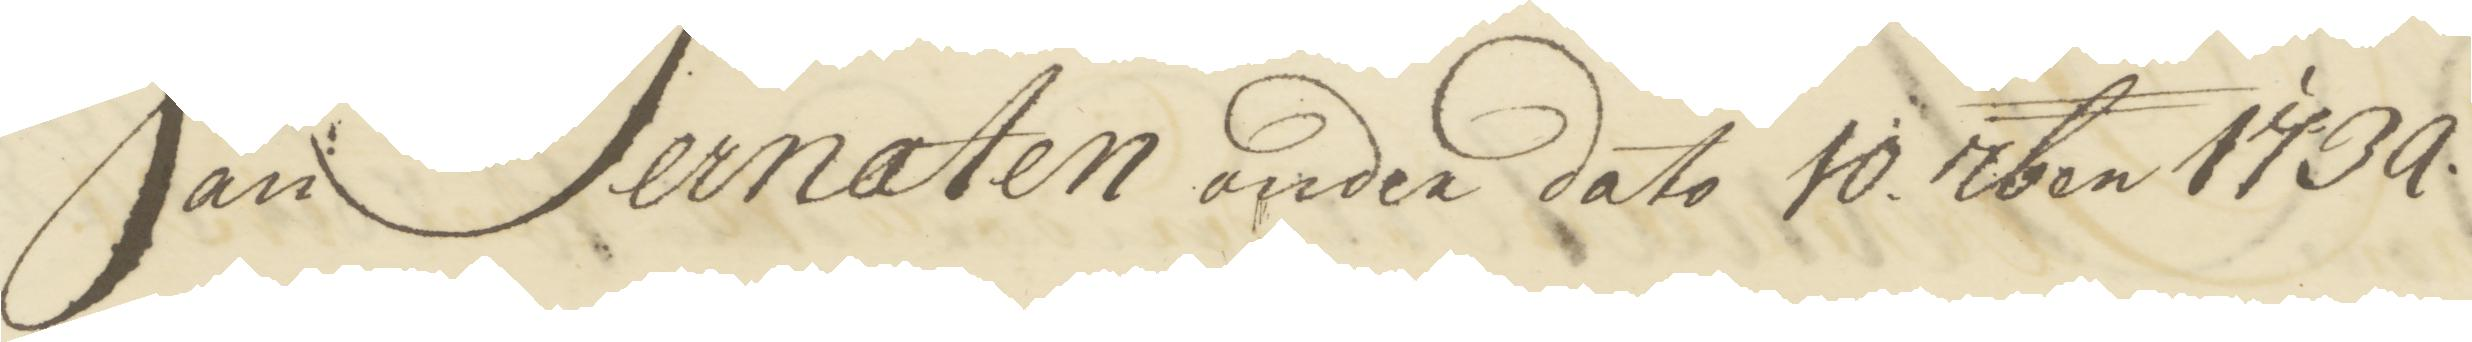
Van Ternaten onder dato 10. 7ber 1734.
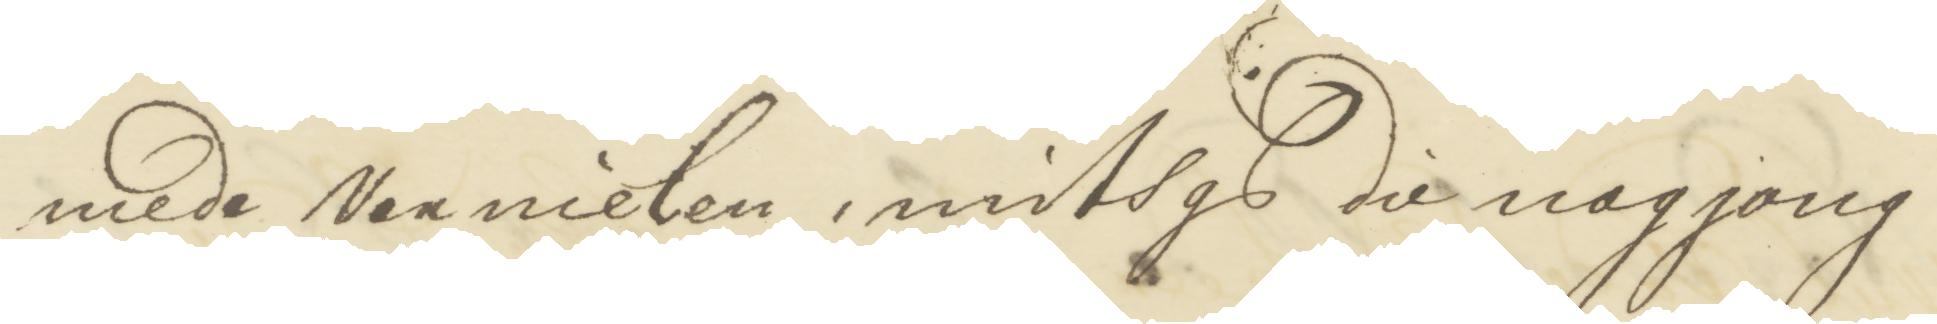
mede vernielen, mitsgs die nog jong
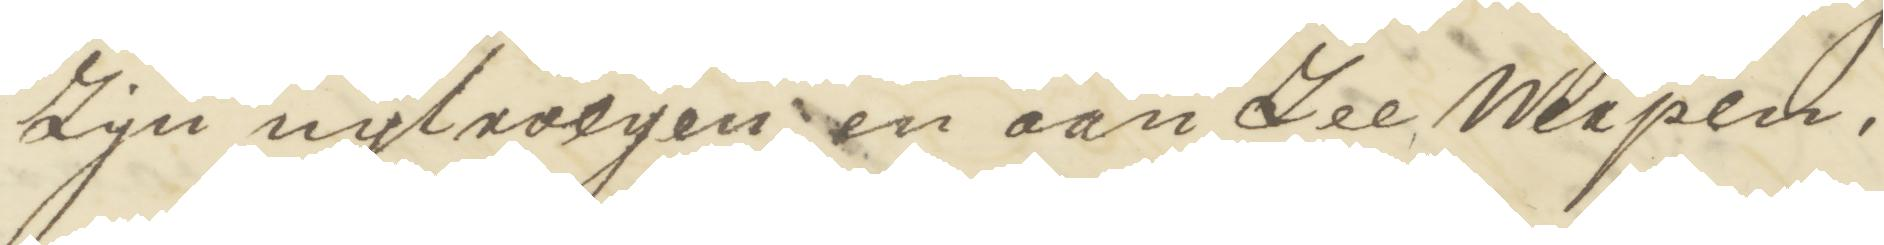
zijn uijtroeijen en aan zee werpen,
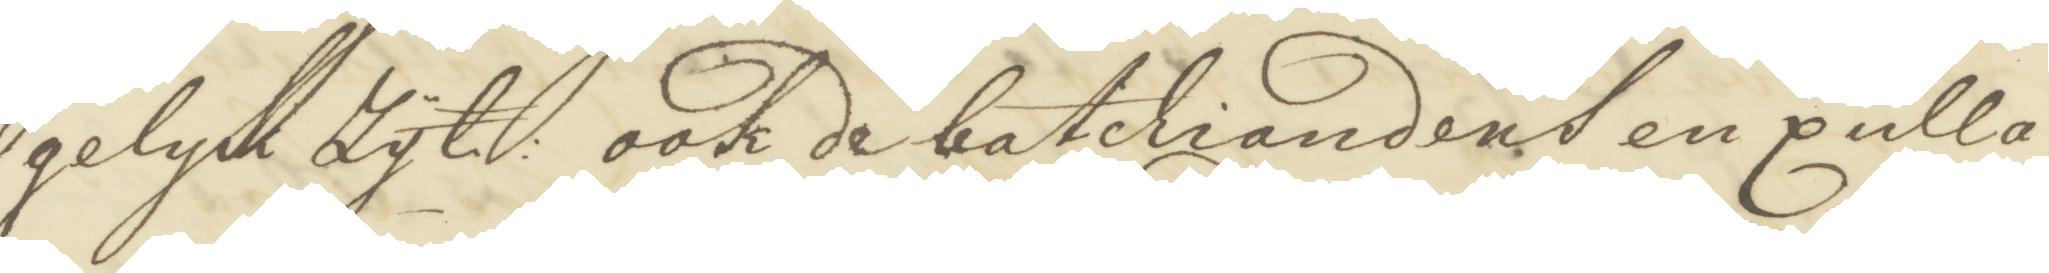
gelyk zijl: ook de batchianders en xulla
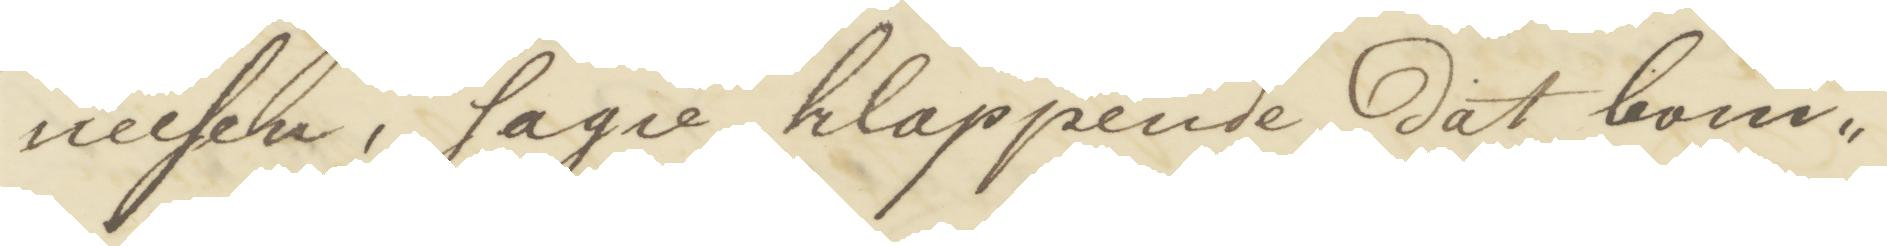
neesen, sagie klappende dat bom„
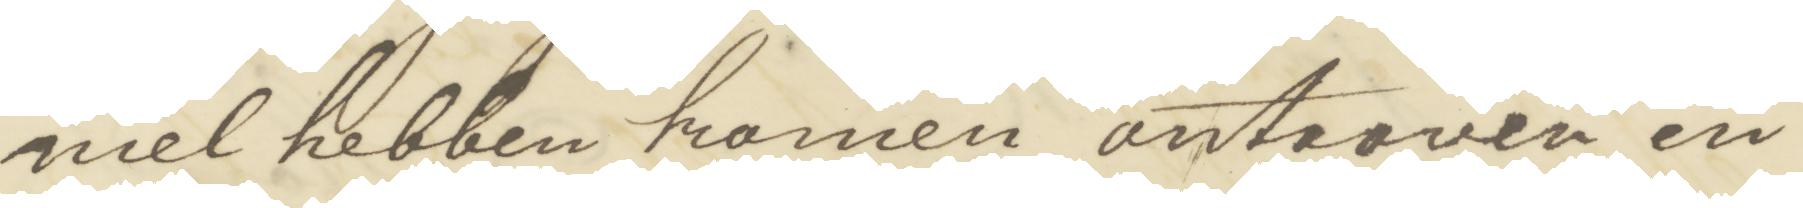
mel hebben komen ontroven en
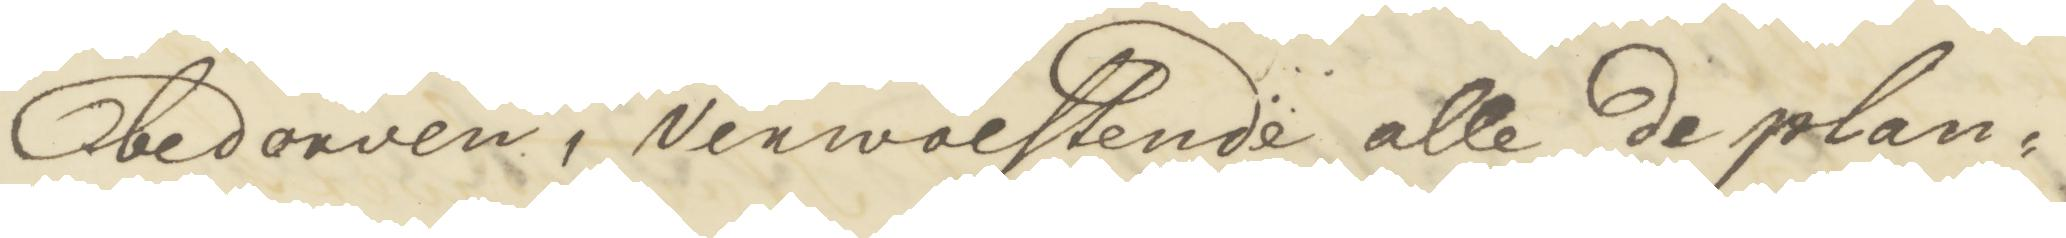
bedorven, verwoestende alle de plan„
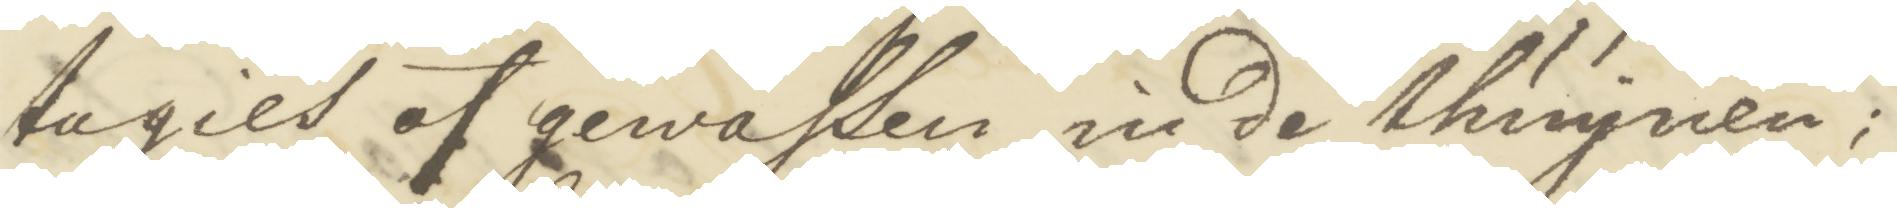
tagies of gewassen in de thuijnen;
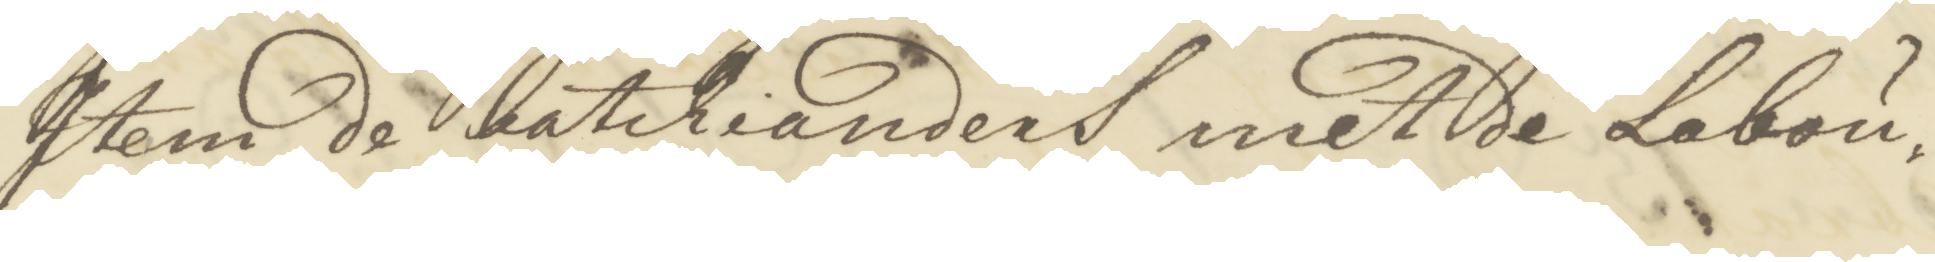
Jtem de batchianders met de Lebou„
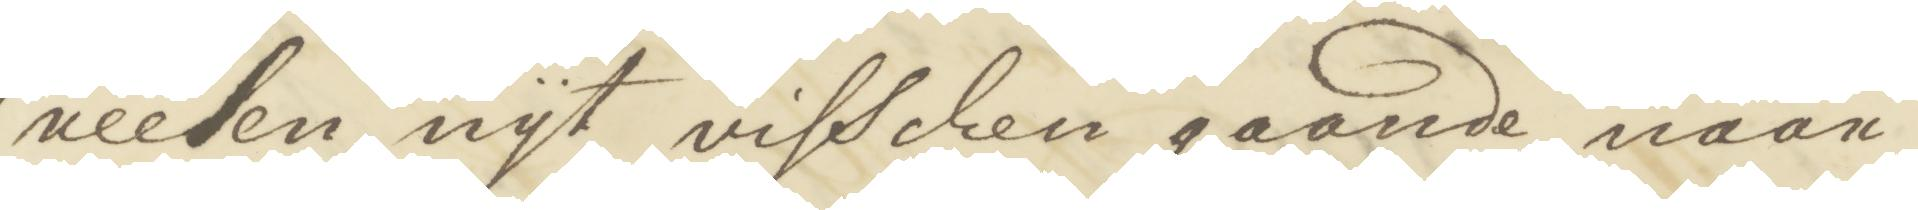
reesen uijt visschen gaande naar
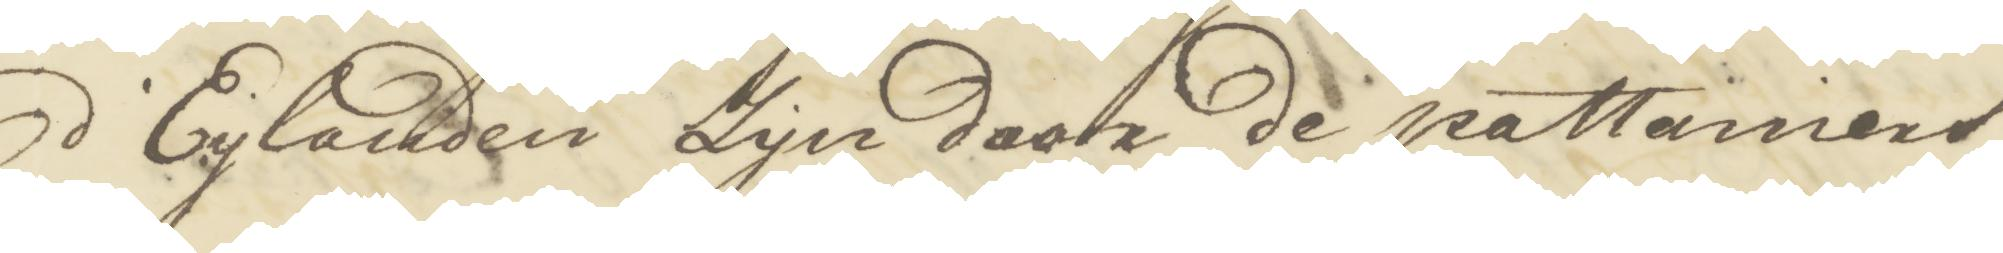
d’Eijlanden zijn daar de pattaniers
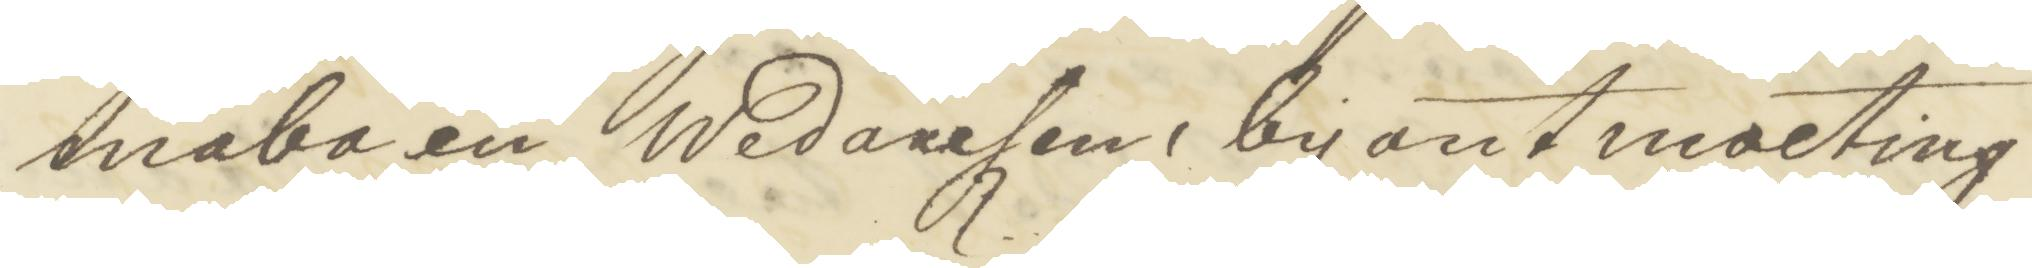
maba en wedaresen, bij ontmoeting
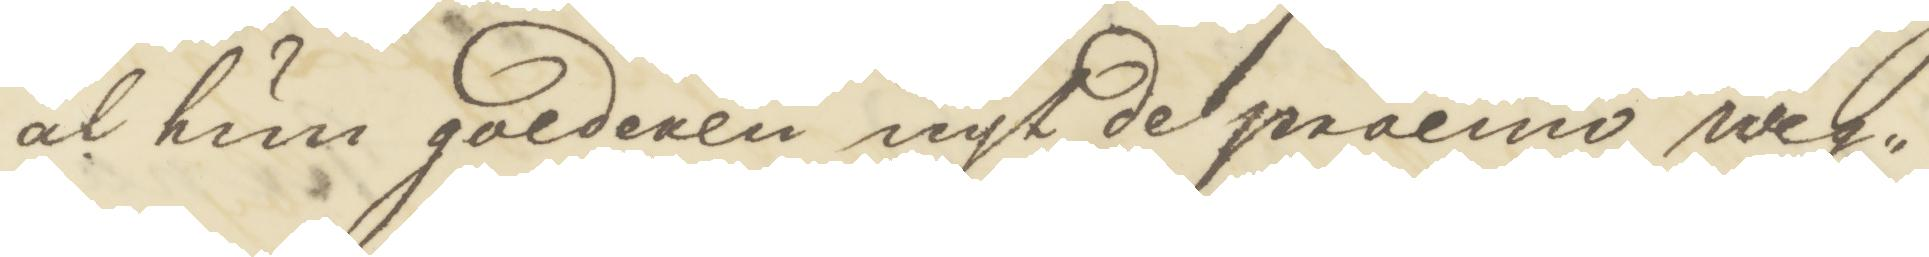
al hun goederen uijt de praeuw weg„
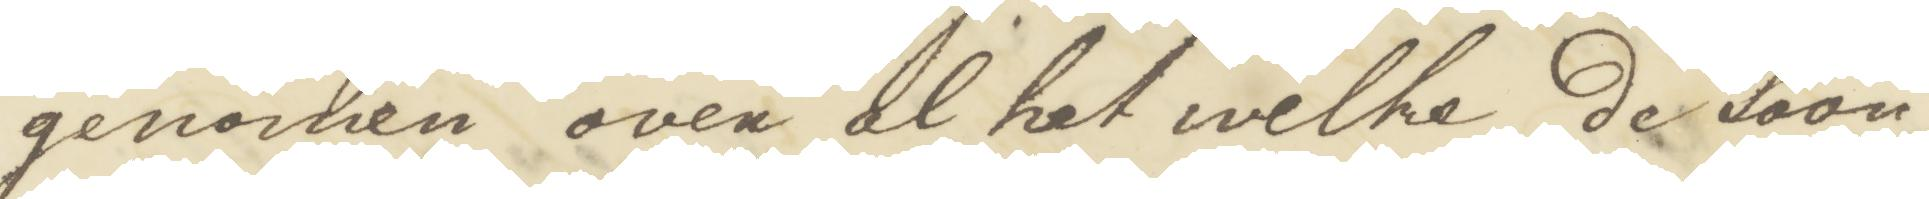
genomen over al het welke de soon
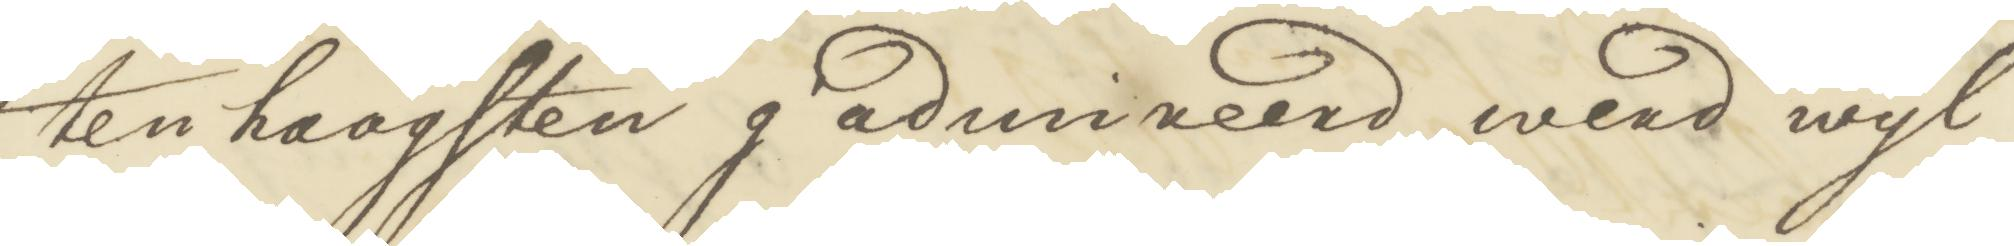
ten hoogsten g’admireerd werd wijl
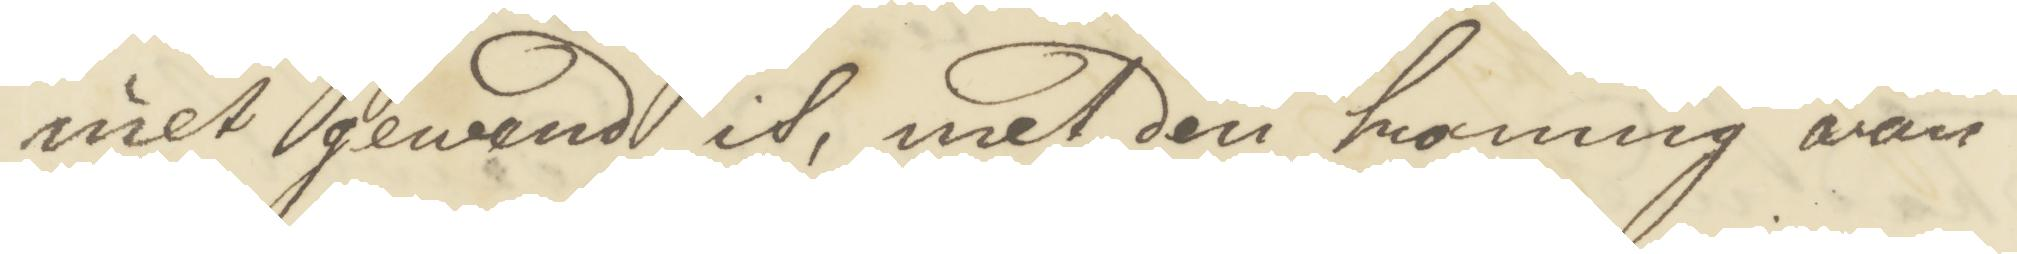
niet gewend is, met den koning van
